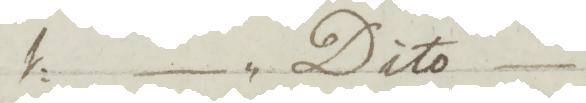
1: —„ Dito —
